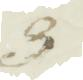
3 „ —
